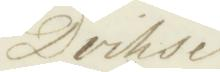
Dirkse
